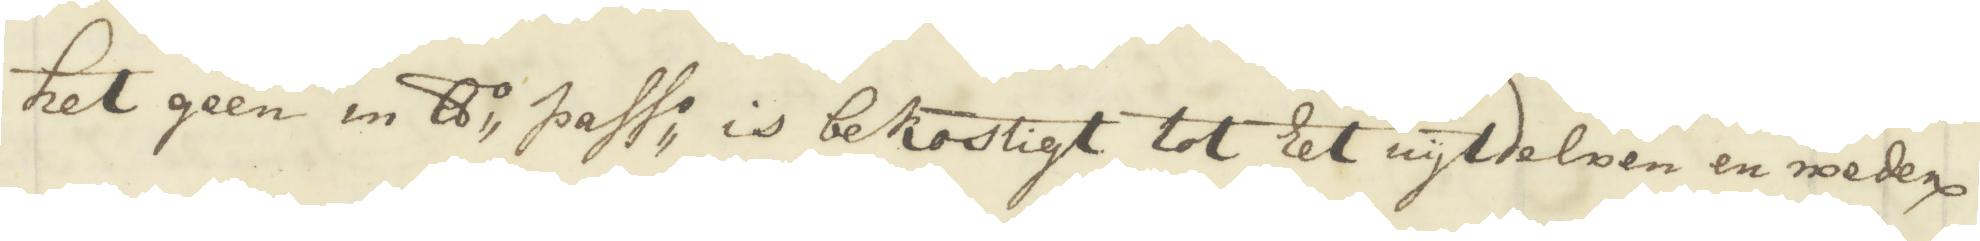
het geen in A„o pass„o is bekostigt tot het uijtdelven en weder
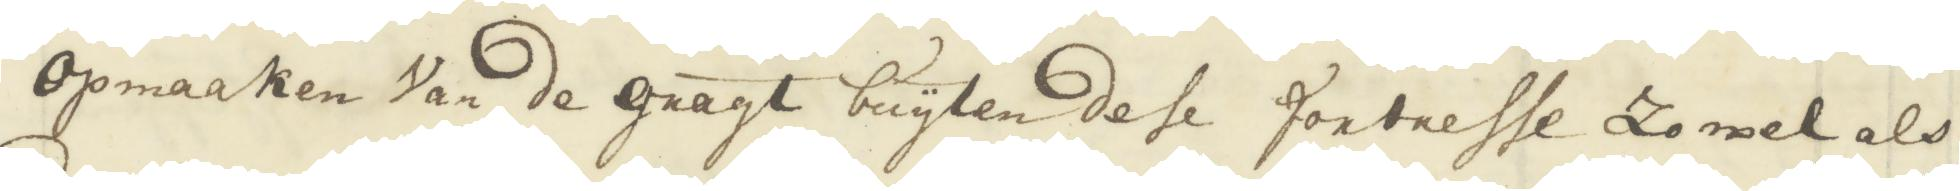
opmaaken van de gragt buijten dese fortresse zo wel als
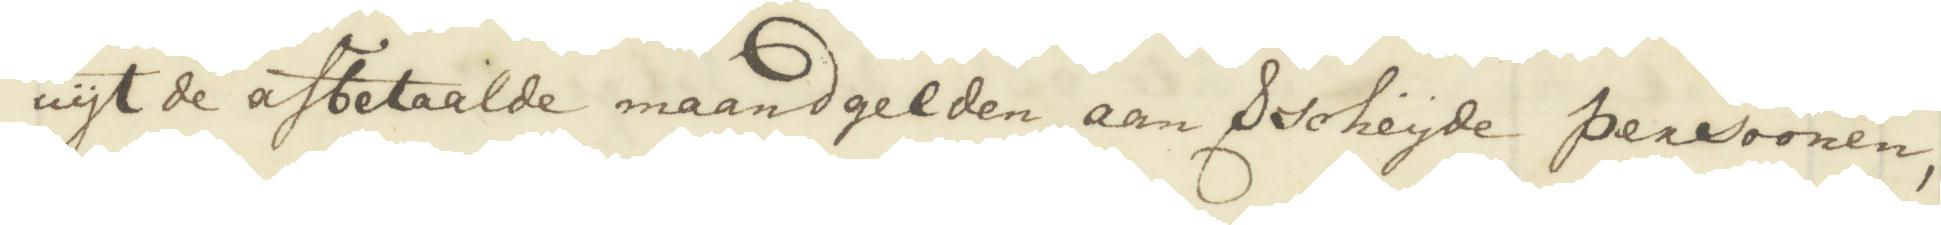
uijt de afbetaalde maandgelden aan verscheijde persoonen
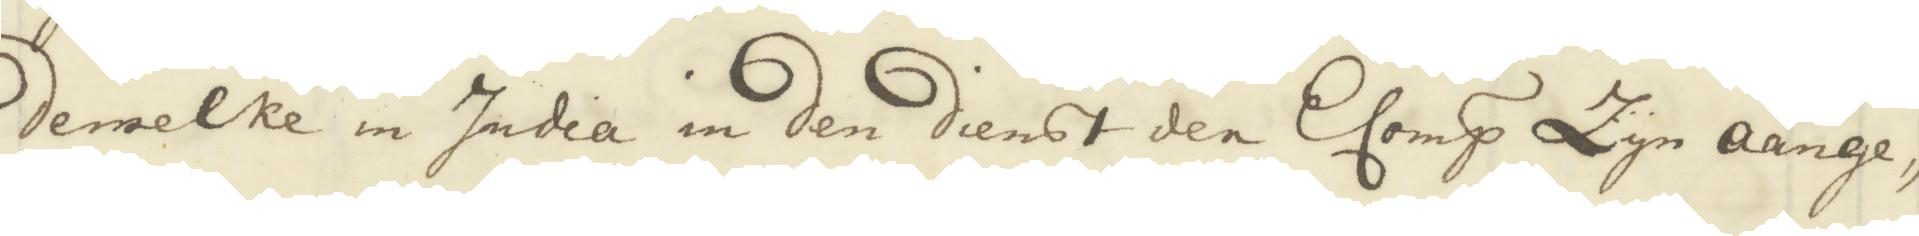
dewelke in Jndia in den dienst der E Comp zijn aange
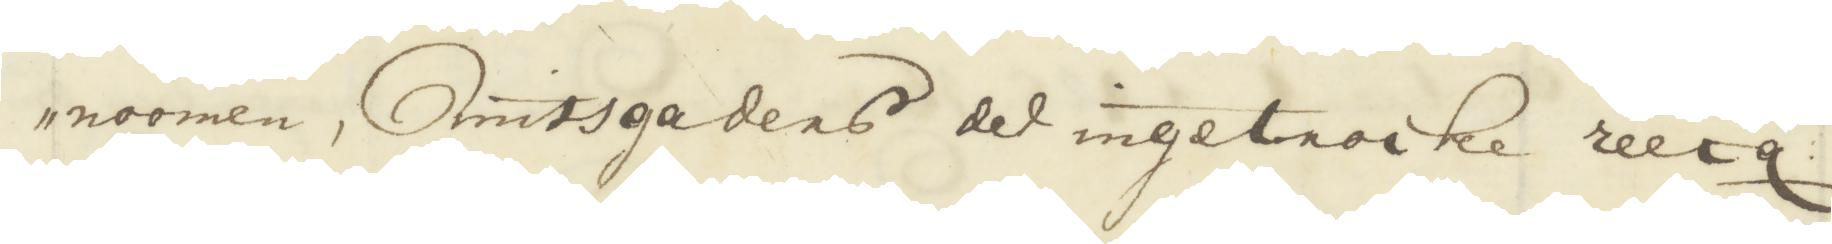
„noomen, mitsgaders de ingetrocke reecq:
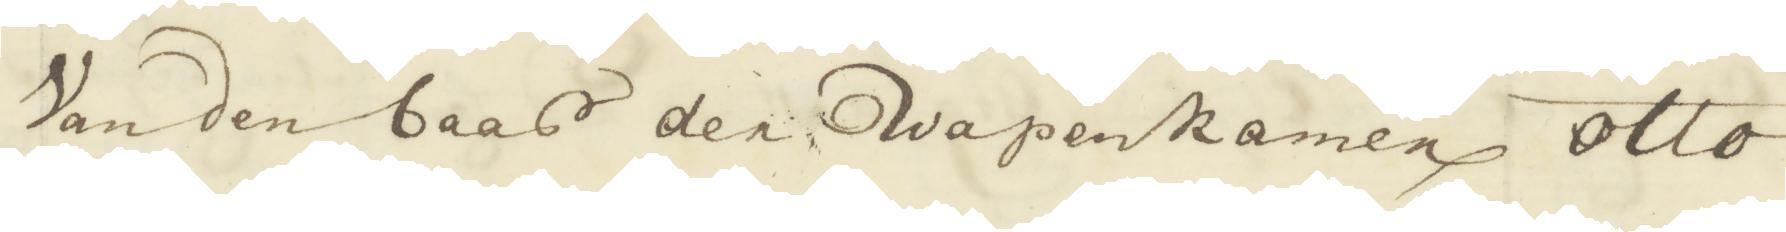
van den baas der wapenkamer otto
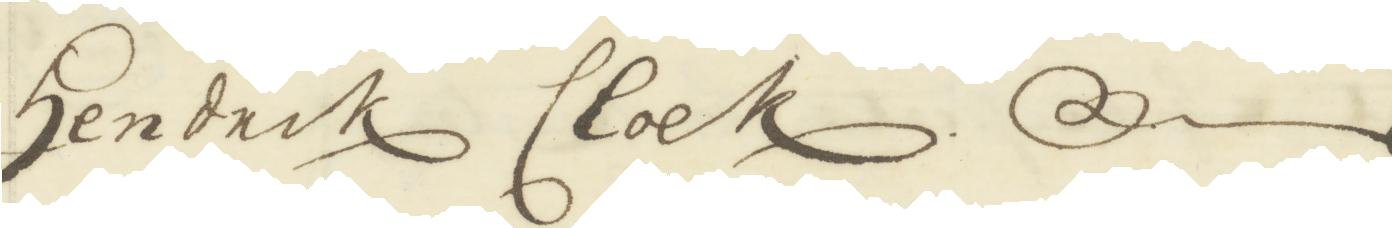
Hendrik Cloek.
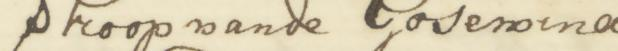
verkoop van de Gosewina
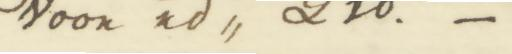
voor rd„s 210. –
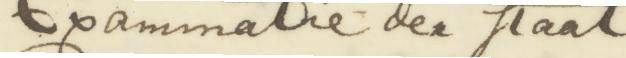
Examinatie der staat
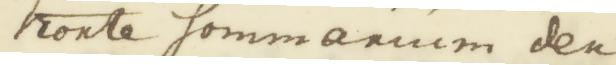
korte sommarium der
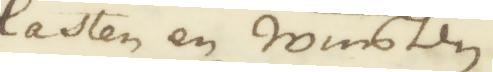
lasten en winsten
